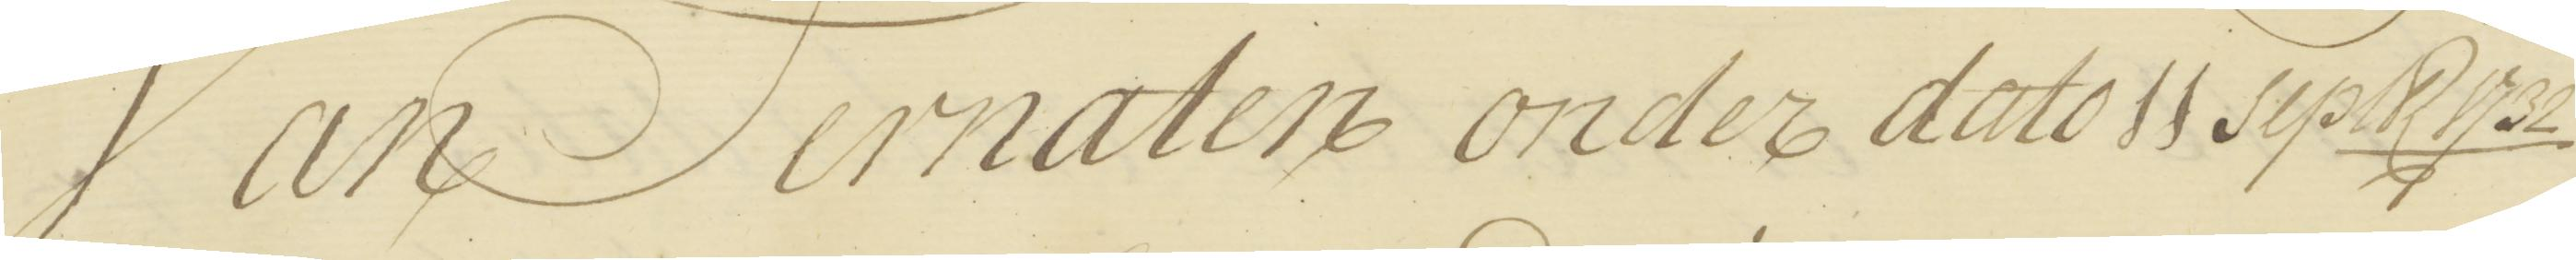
Van Ternaten onder dato 11 septb 1732
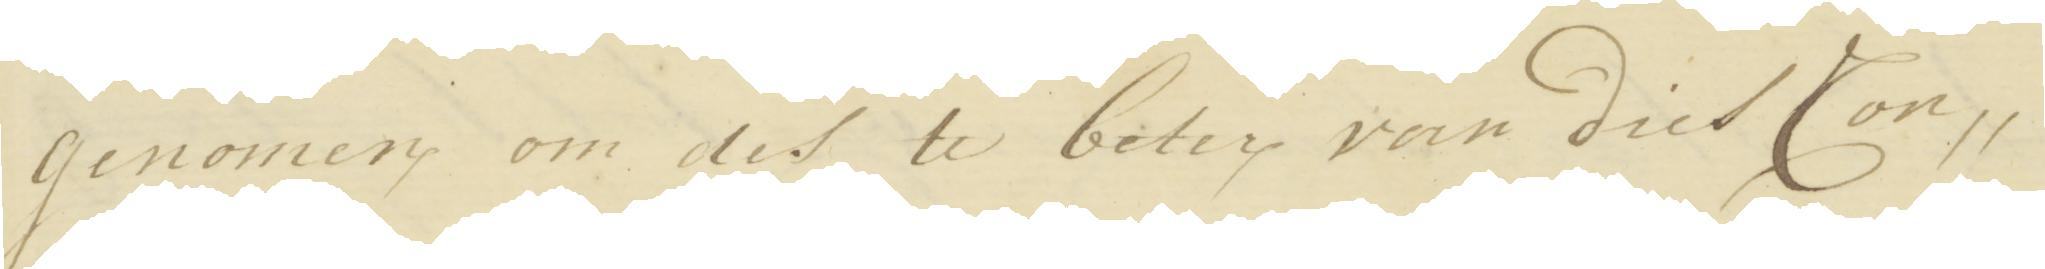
genomen om des te beter van dies Con„
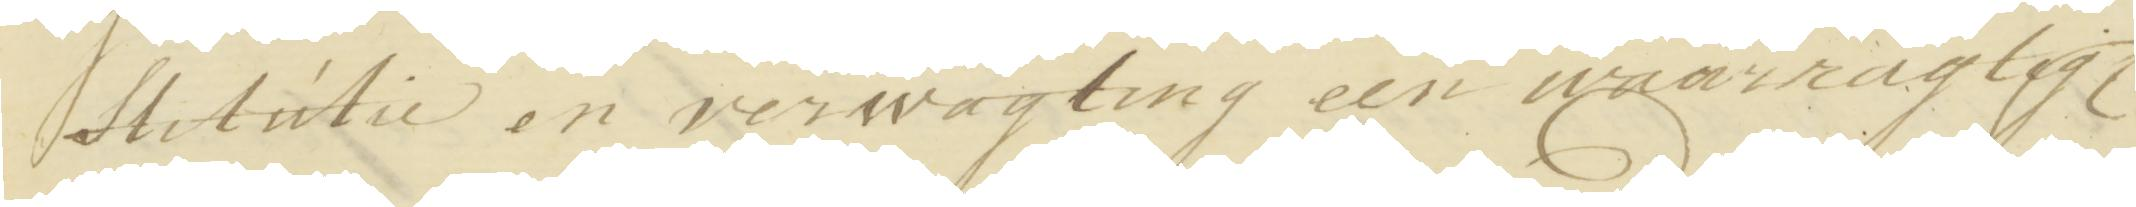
stitutie en verwagting een waarragtigh
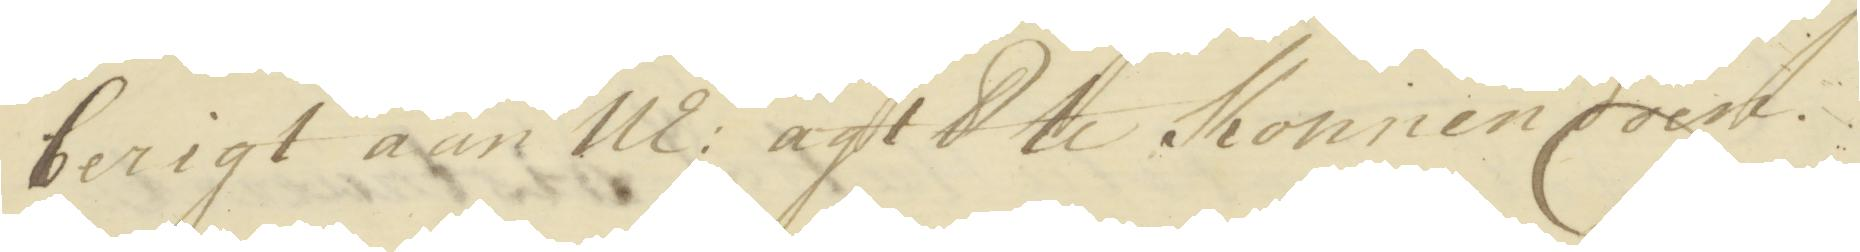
berigt aan UE: agtb te Konnen doen.
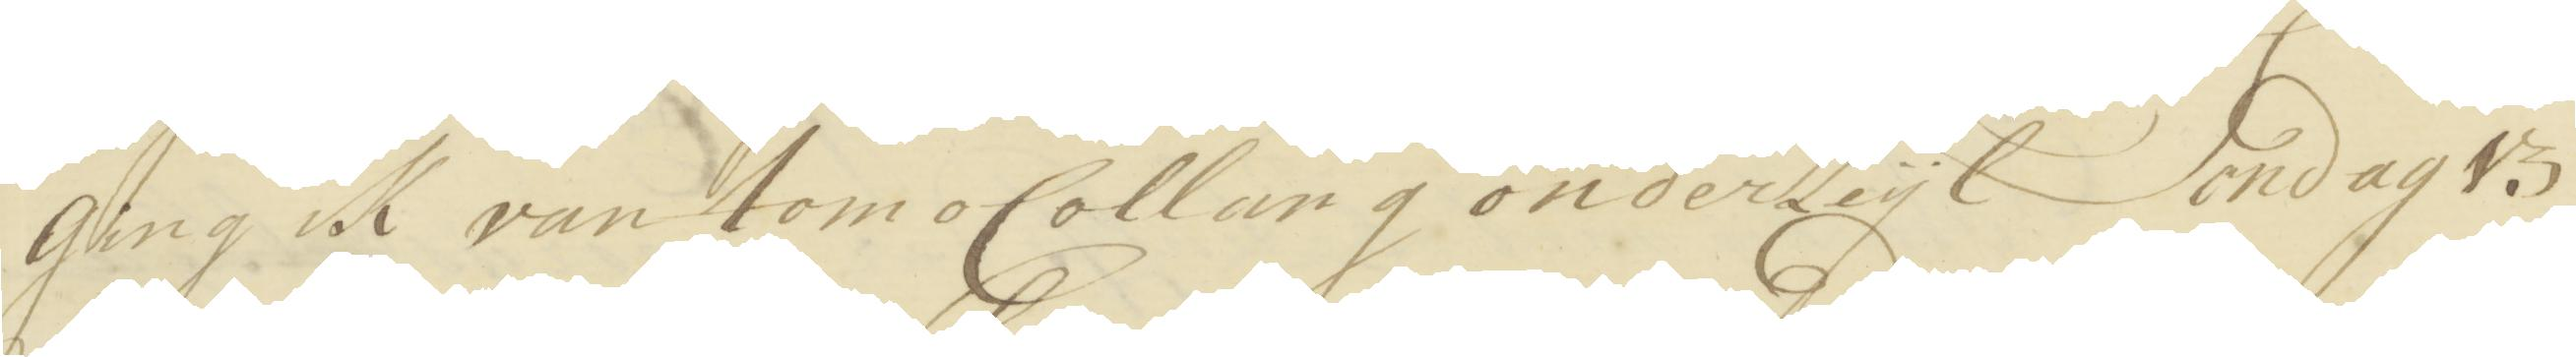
ging ik van tomo Collang onder Zeijl Sondag 13
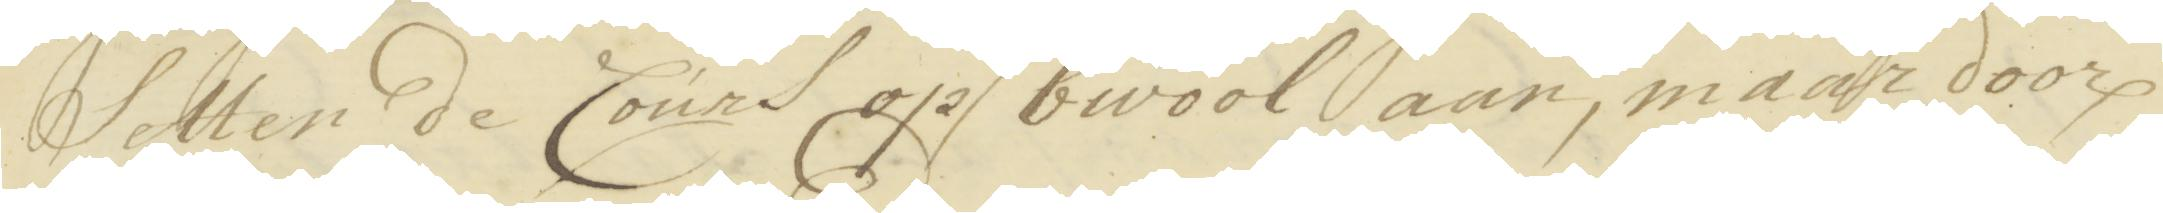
Setten de Cours op bwool aan, maar door
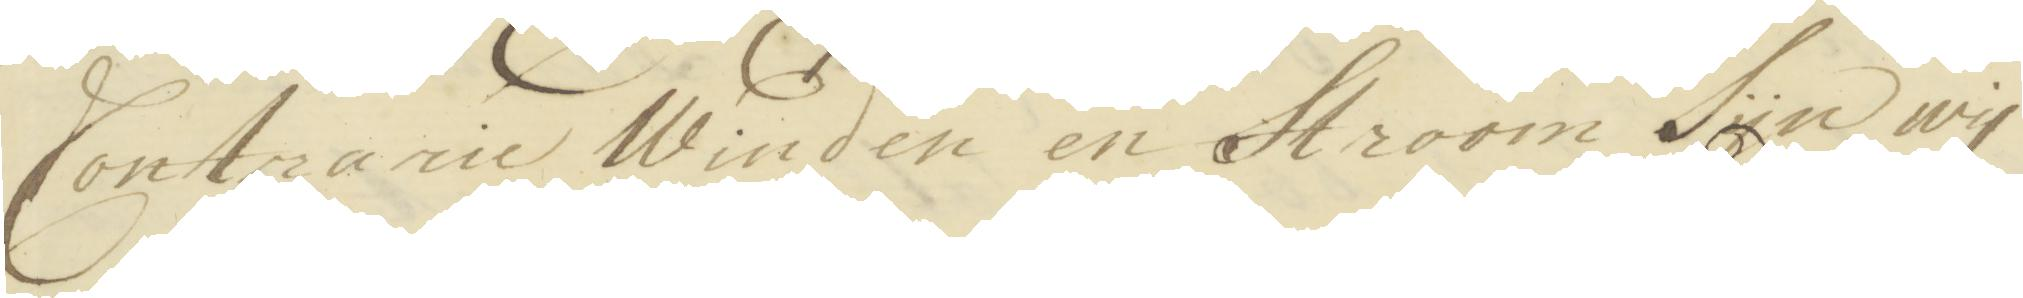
Contrariee Winden en Stroom Sijn wij
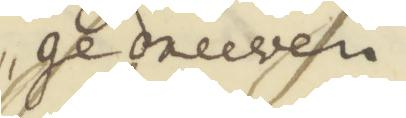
„gedreeven
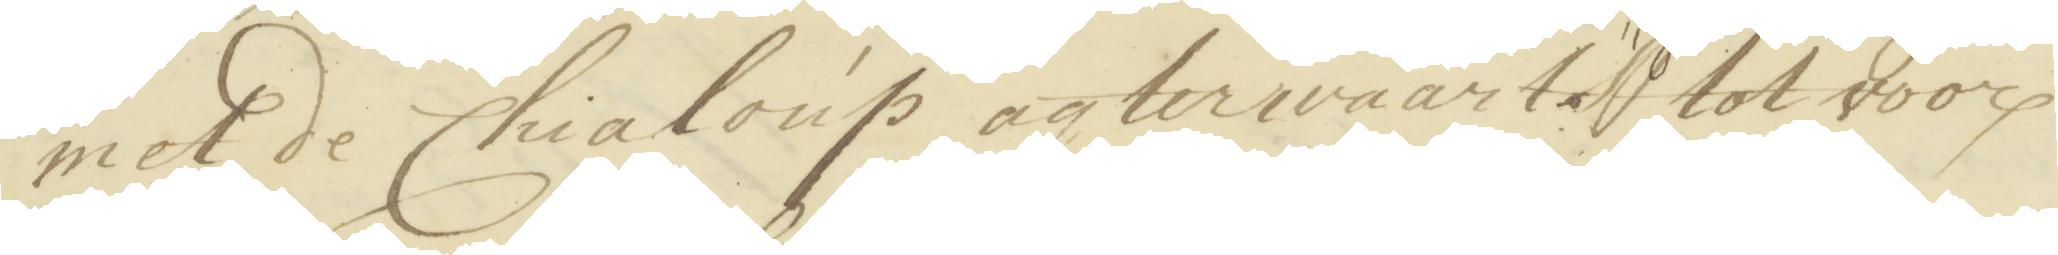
met de Chialoup agterwaarts „ tot voor
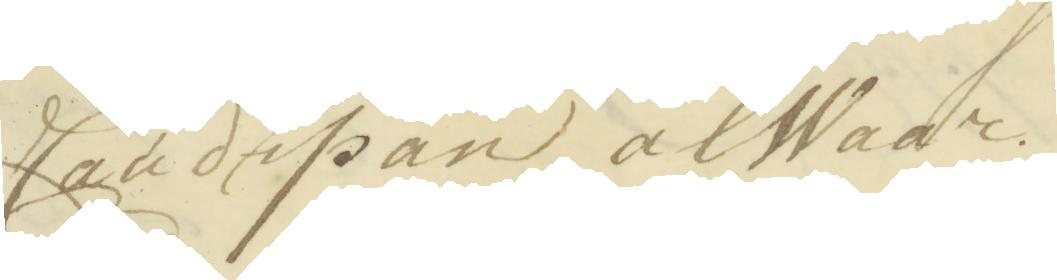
Caudipan alwaar.
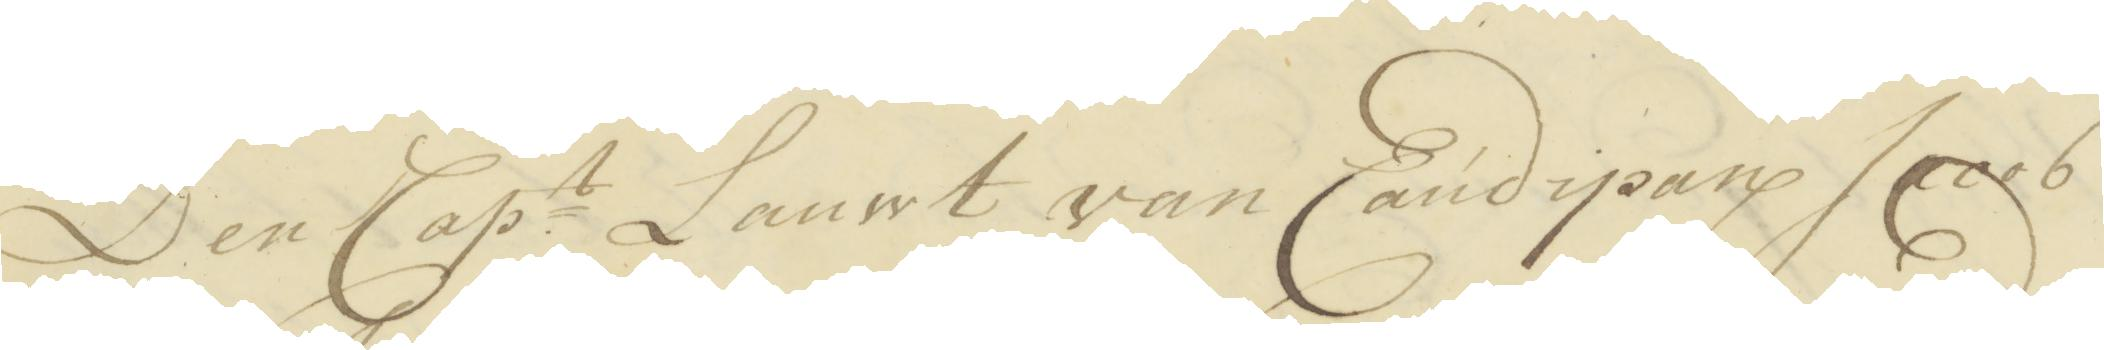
Den Cap=t Lauwt van Caudipan Jacob
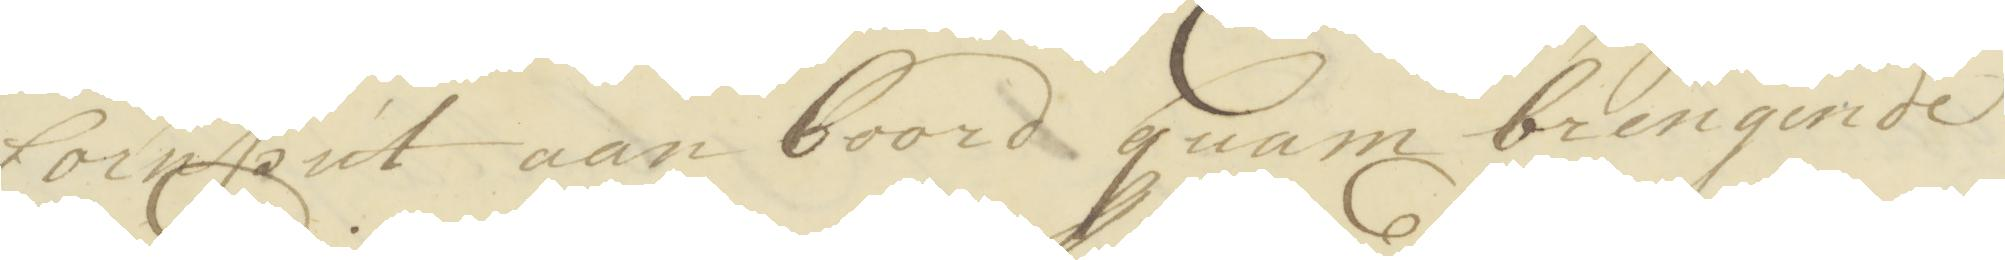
Cornput aan boord quam brengende
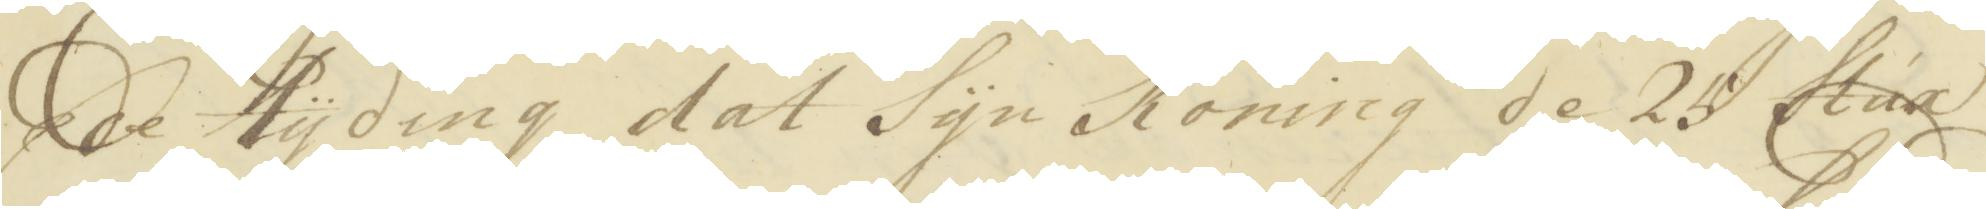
de tijding dat Sijn Koning de 25 Stux
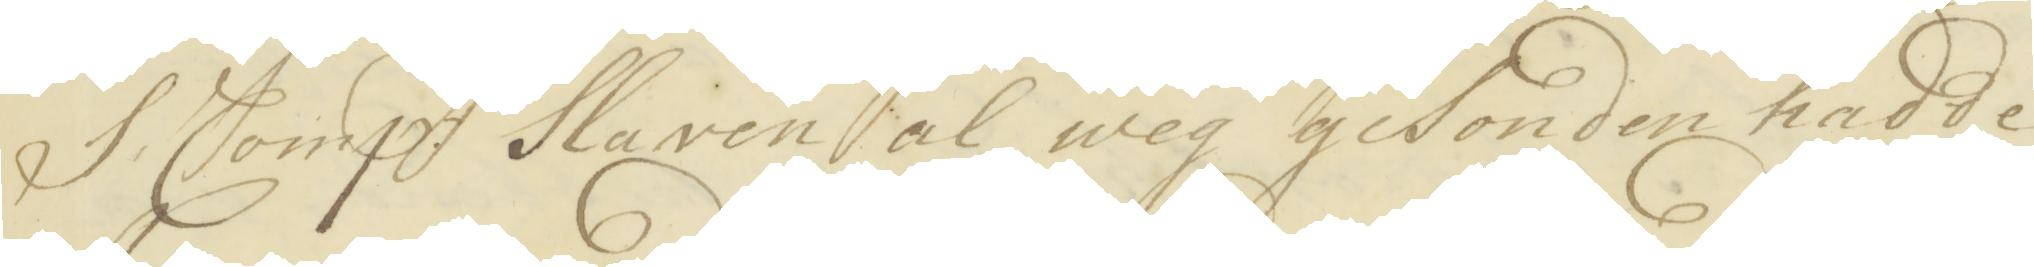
S' Comp:s Slaven al weg gesonden hadde
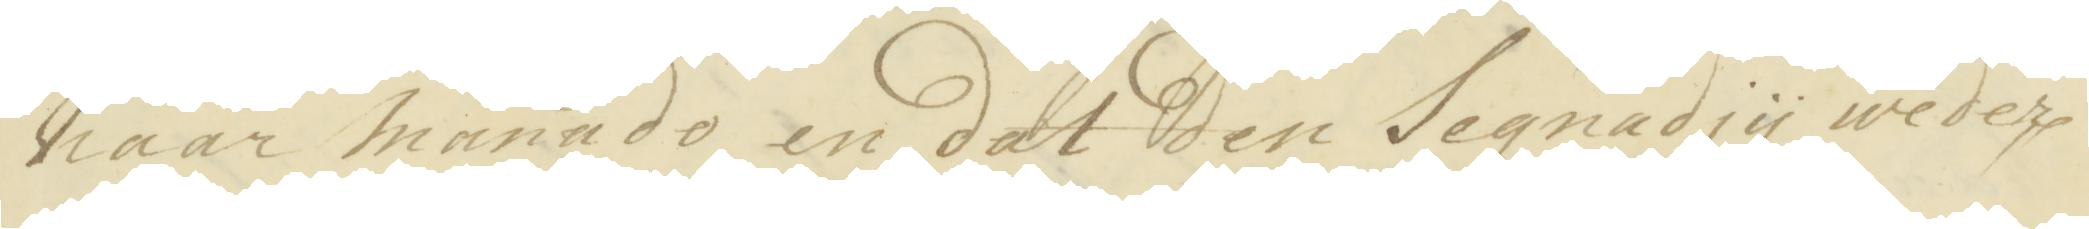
naar manado en dat den Segnadjij weder
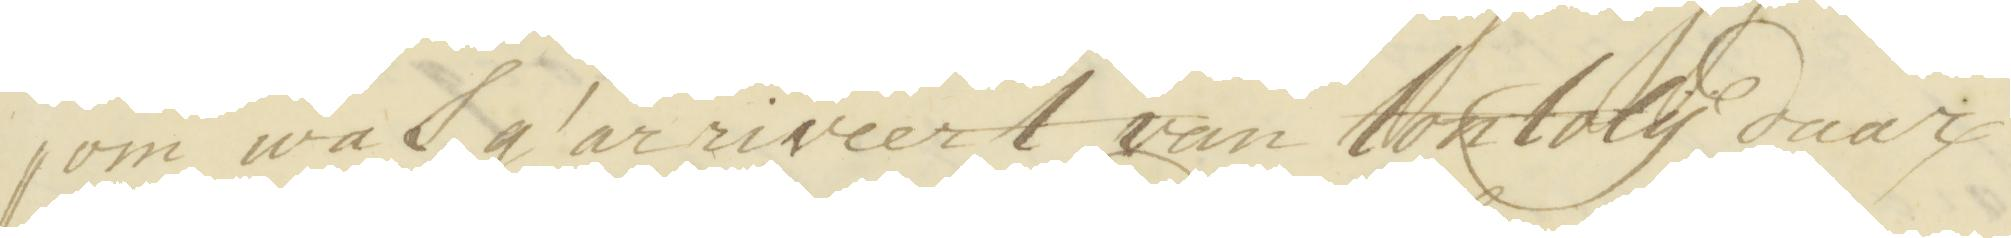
om was g’arriveert van tontolij daar
